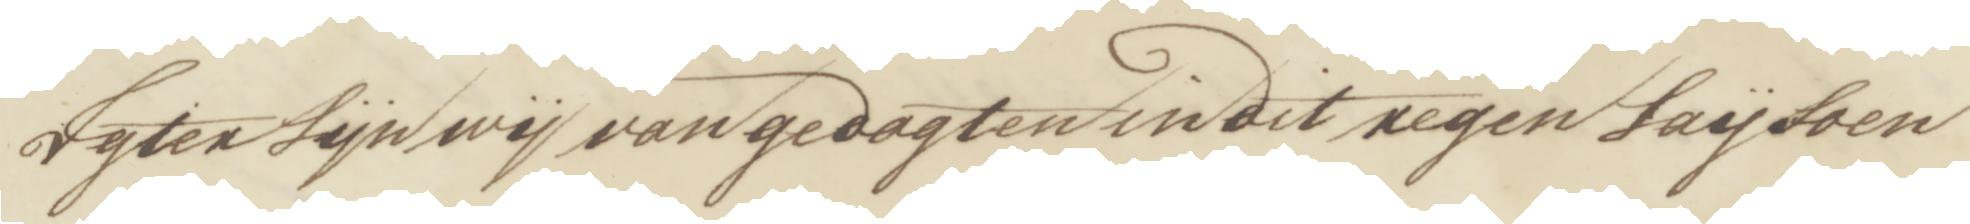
Egter sijn wij van gedagten in dit regen saijsoen
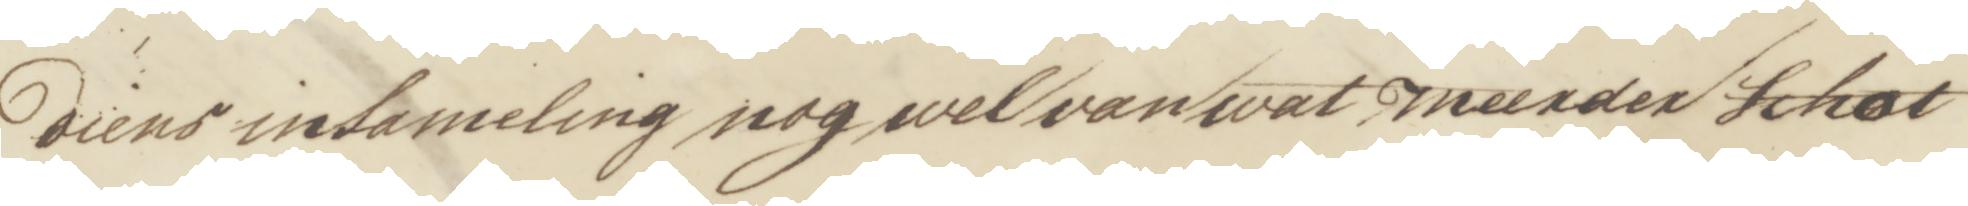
diens insameling nog wel van wat meerder schot
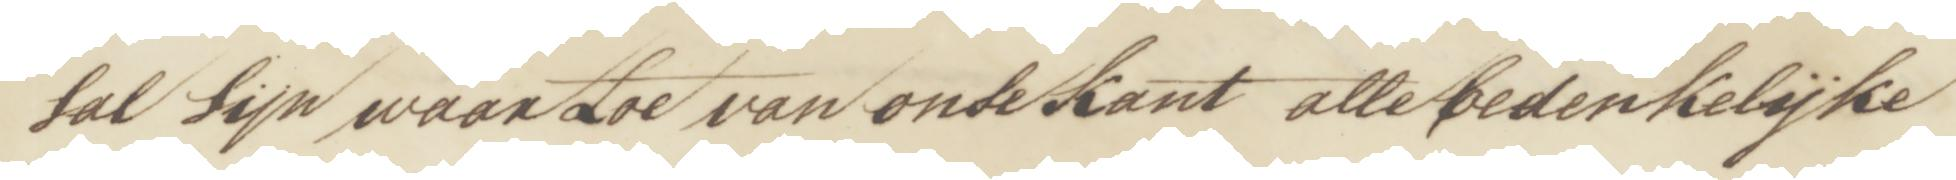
sal sijn waar toe van onse kant alle bedenkelijke
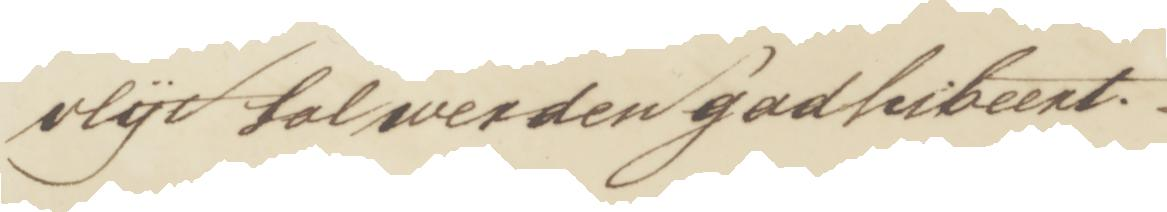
vlijt sal werden g'adhibeert.
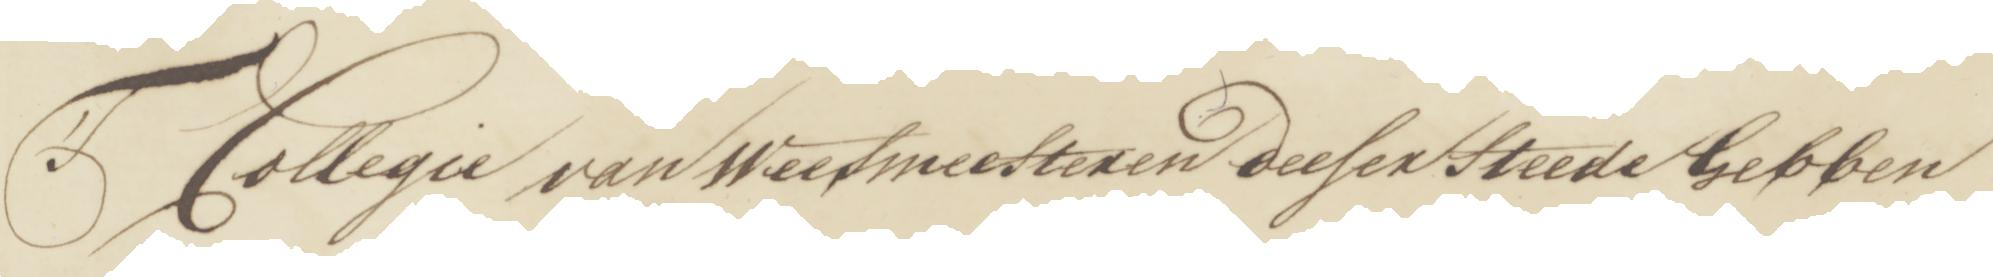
'T Collegie van weesmeesteren deeser steede hebben
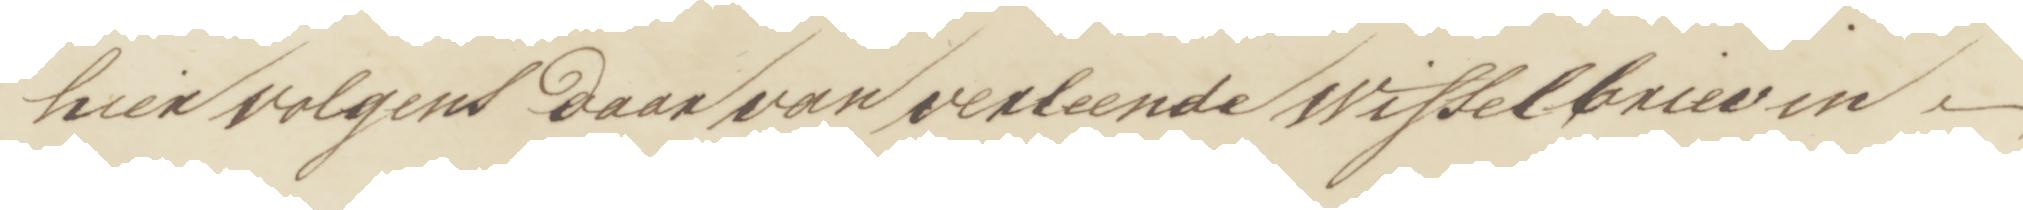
hier volgens daar van verleende wisselbrieven —
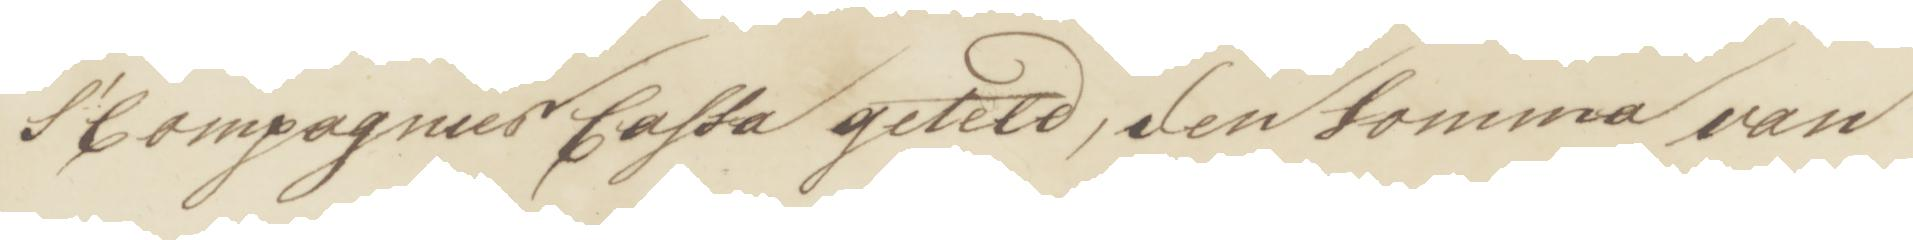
s'Compagnies Cassa geteld, een somma van
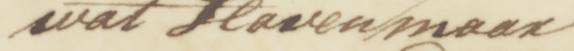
wat slaven maar
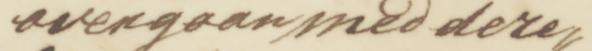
overgaan med dere„
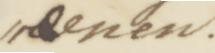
„denen.
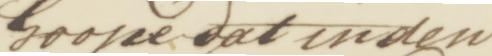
hoope dat in den
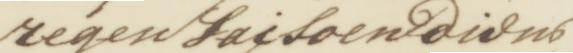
regen saisoen diens
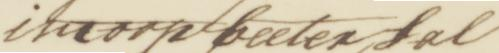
incoop beeter, sal
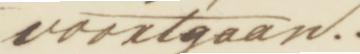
voortgaan.
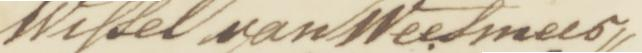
Wissel van Weesmees„
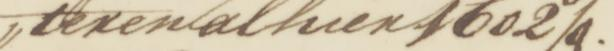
„teren alhier 1602¾.
